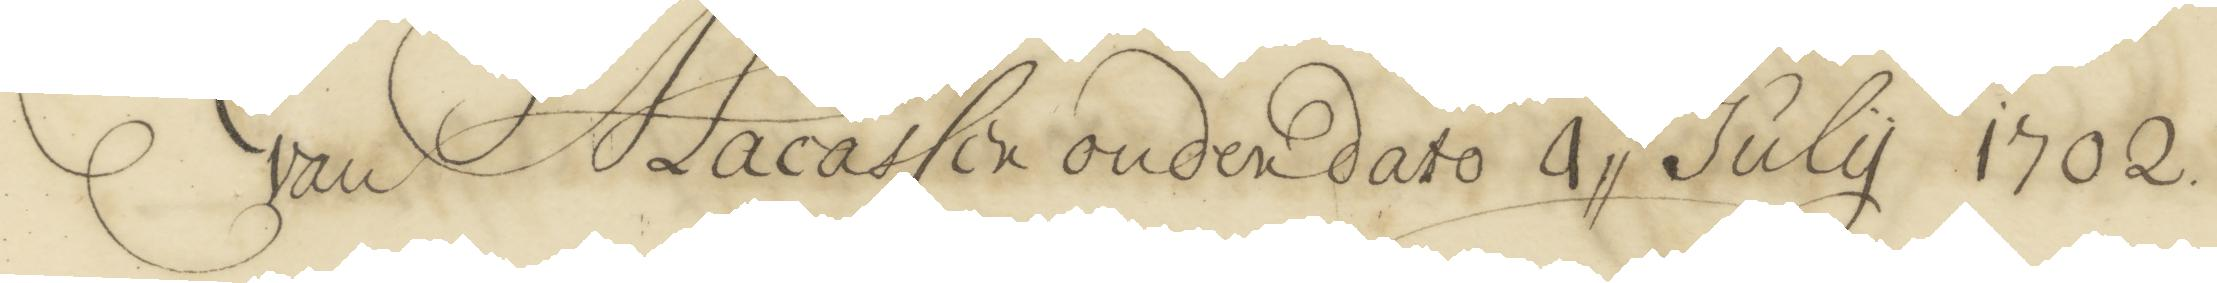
van Macasser onder dato 4„' Iulij 1702.
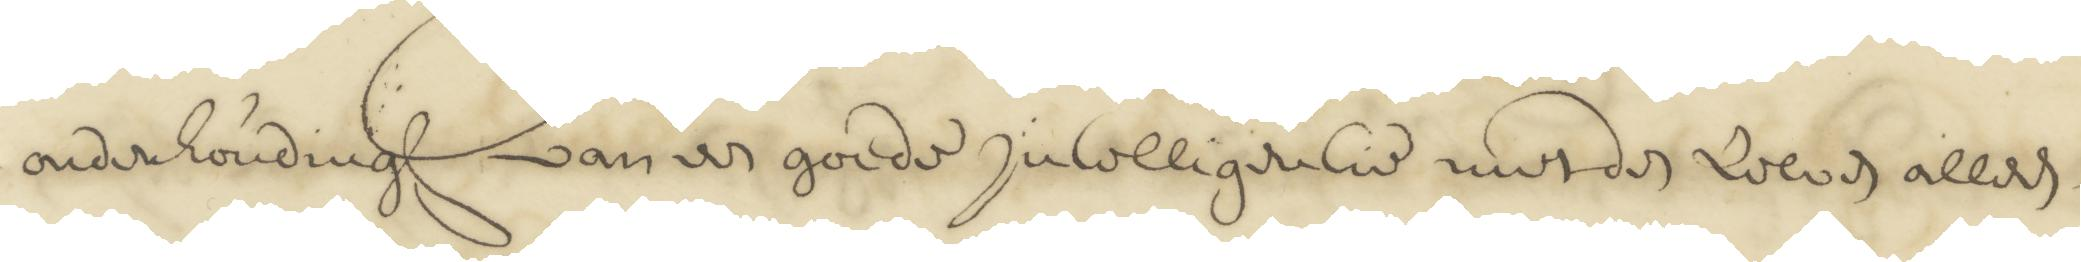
onderhoudingh van een goede jntelligentie met den Zelven alleen
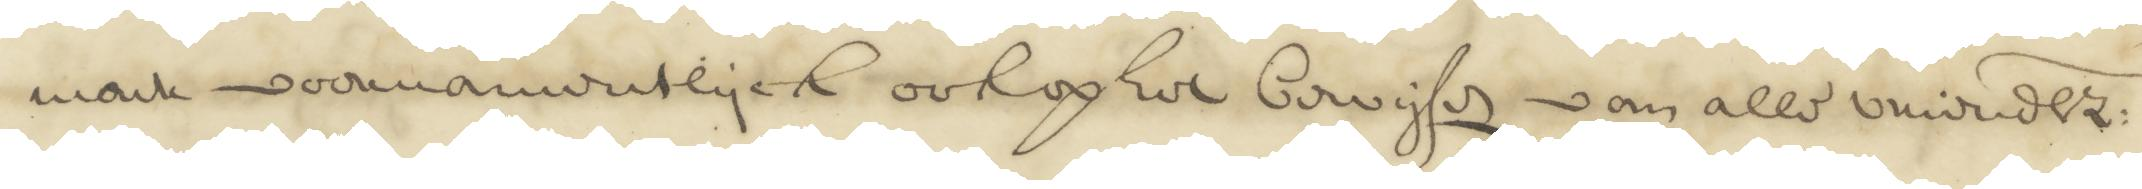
maer voornamentlijck ook op het bewijsen van alle vriendsz:
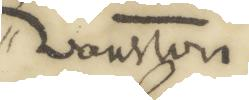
„vorsten
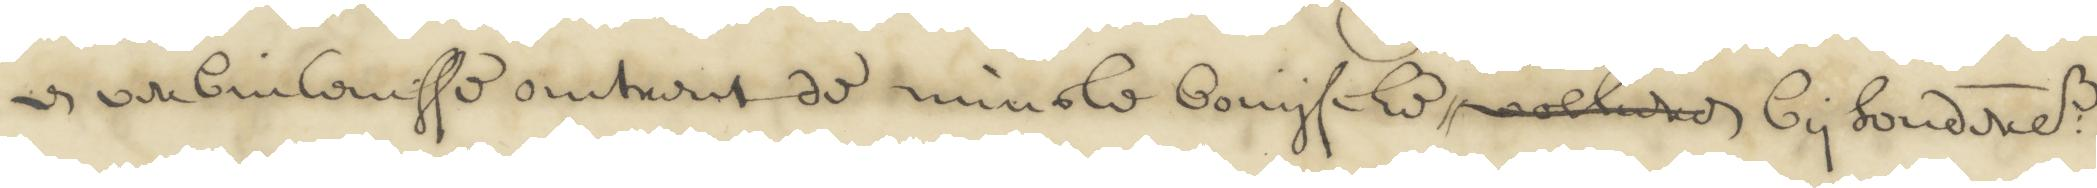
en verbintenisse omtrent de minste bonijsche volkeren „ bij sonderlijk
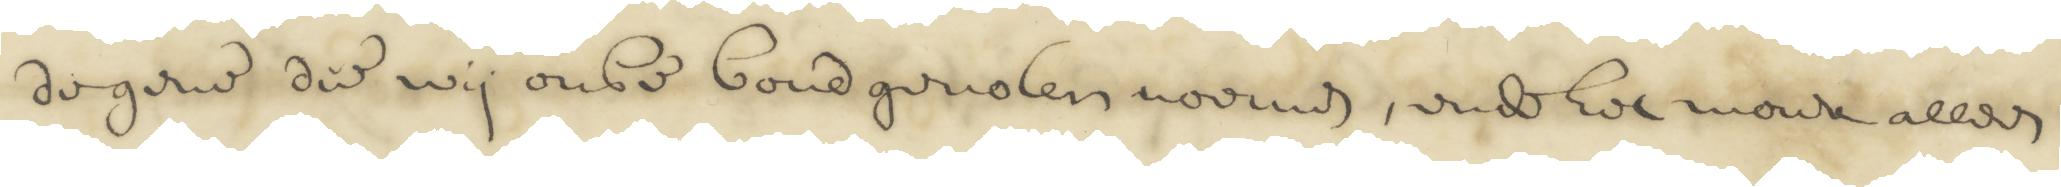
degene die wij onse bondgenoten noemen, ende het maer alleen
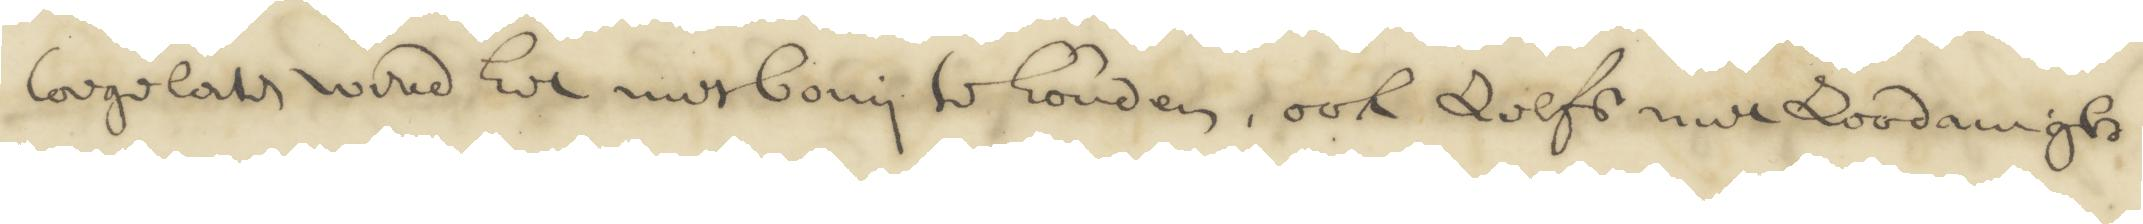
toegelaten werd het met bonij te houden, ook zelfs met Zoodanigh
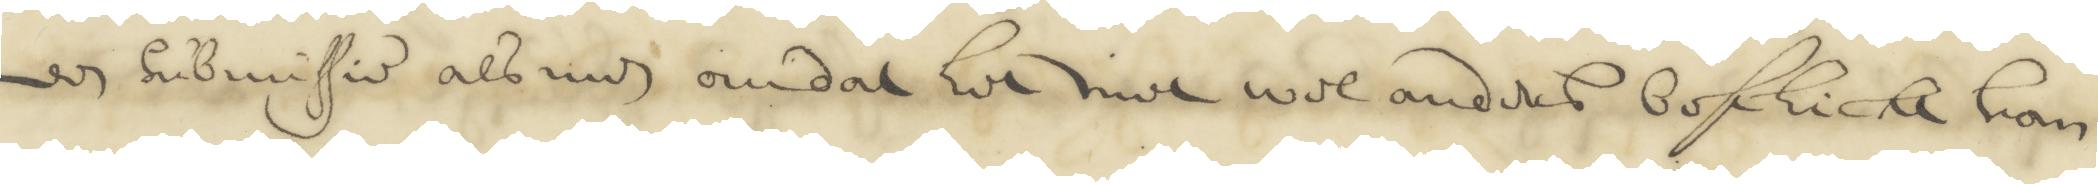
een submissie als men omdat het niet wel anders beschickt kan
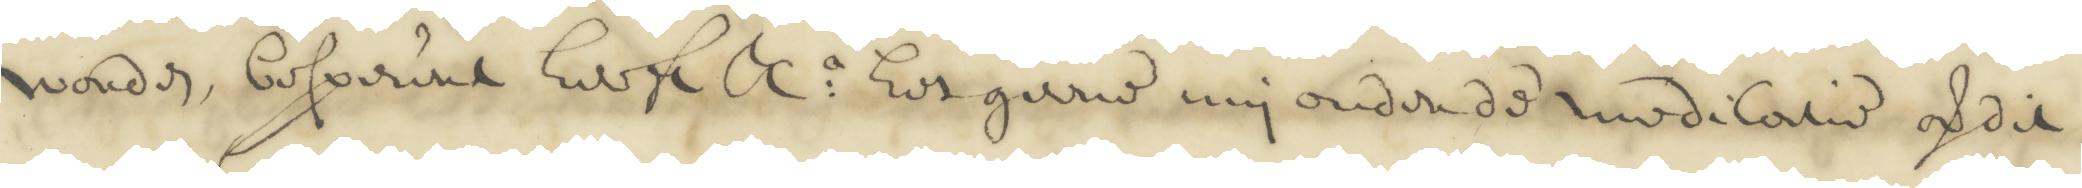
worden, bespeurt heeft &:a het geene mij onder de meditatie over dit
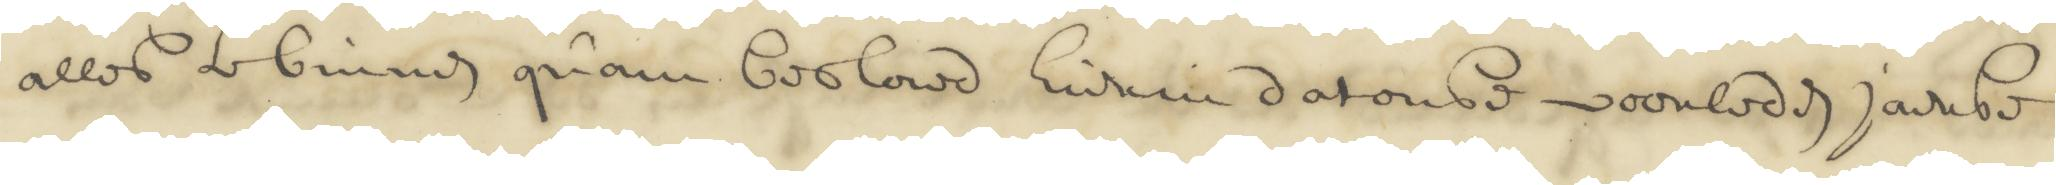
alles te binnen quam bestaed hierin dat onse voorleden Jaerse
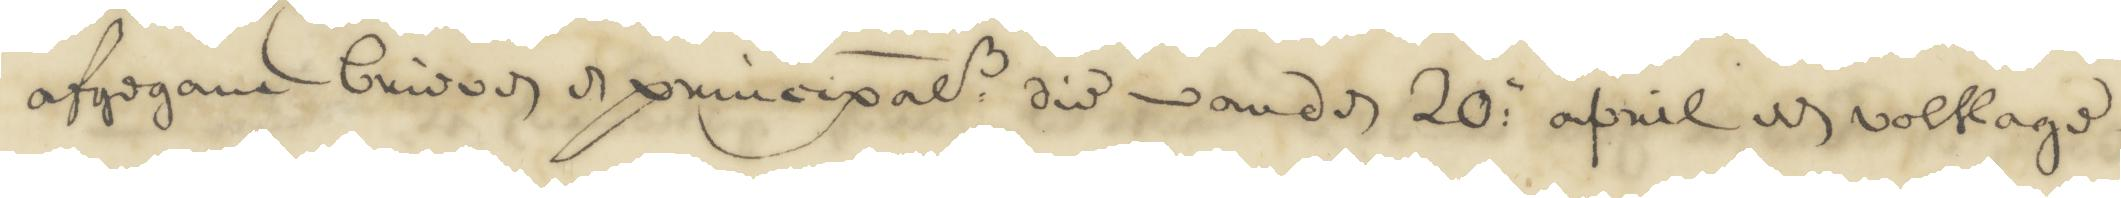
afgegane brieven en principalijk die vanden 20:e april een volslage
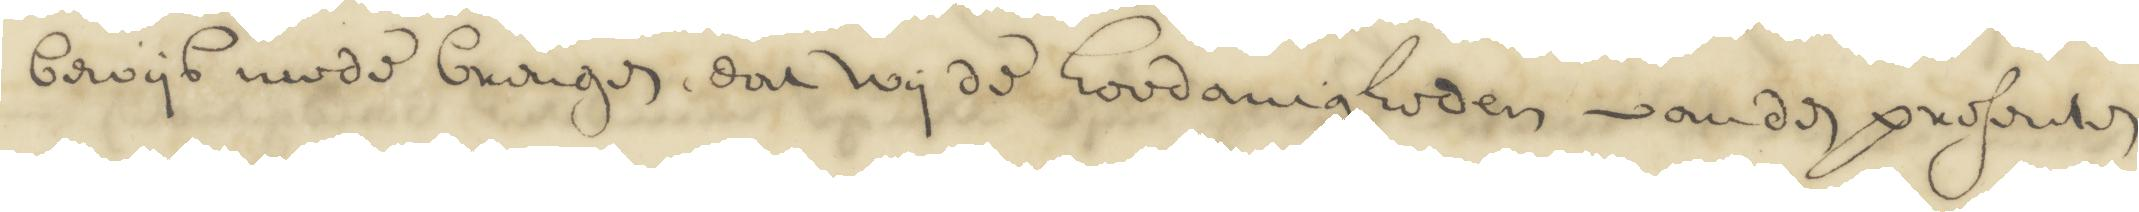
bewijs mede brengen, dat wij de hoedanigheden van den presenten
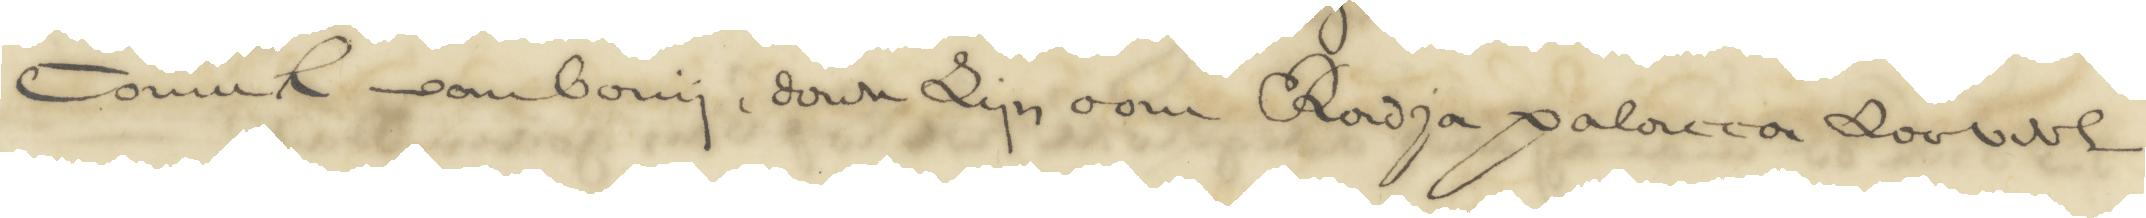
Conink van bonij, daer Zijn oom Radja palacco Zooveel
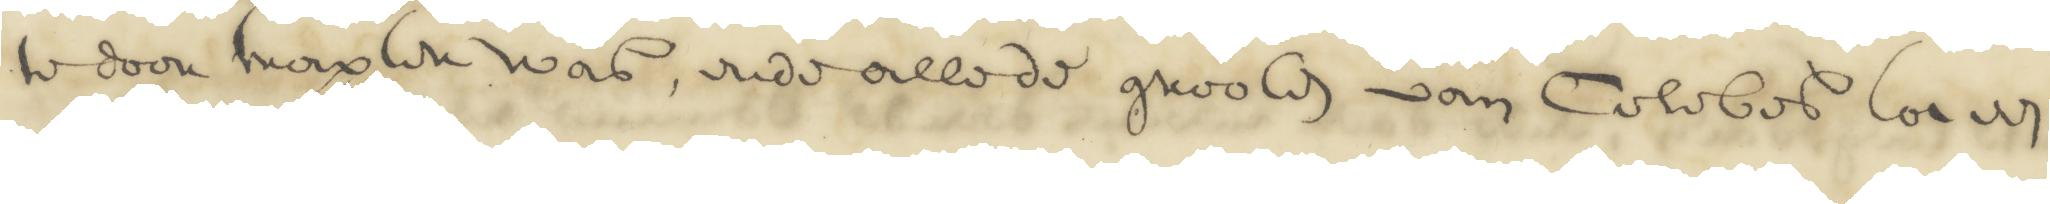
te door trapter was, ende alle de grooten van Celebes tot een
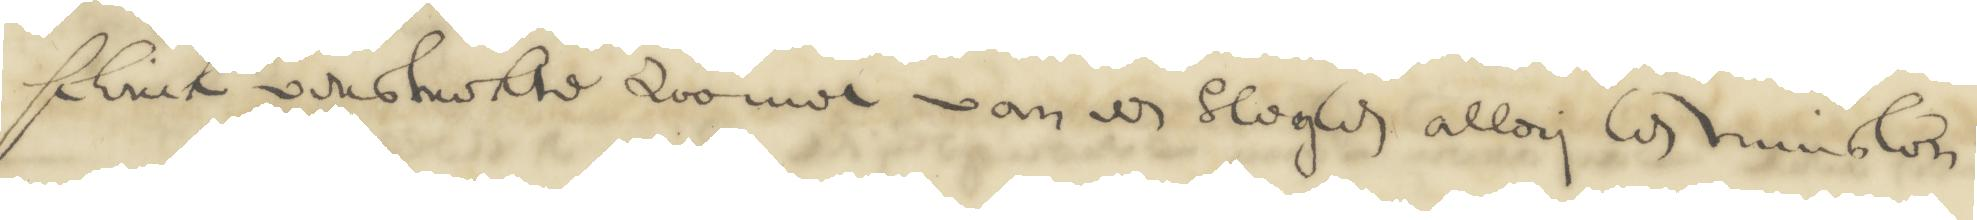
schrick verstrekte Zoo niet van een slegten alloij ten minsten
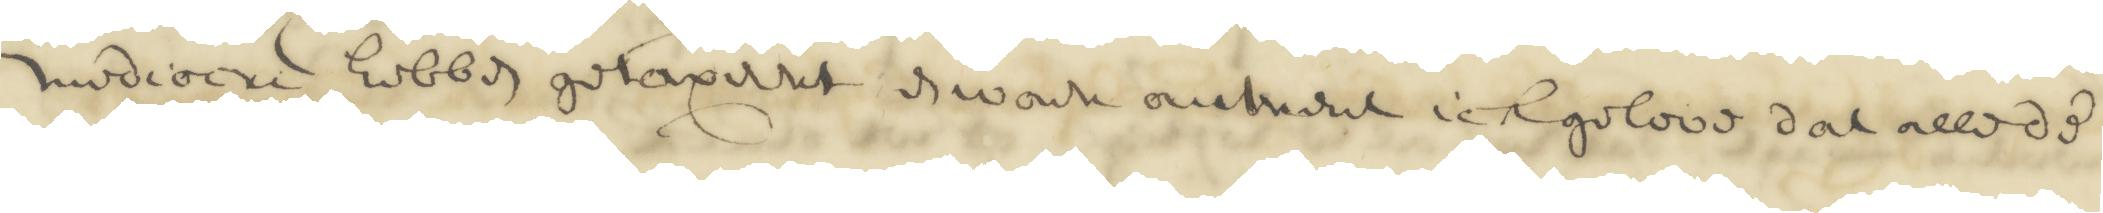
mediocre hebben getaxeert en waer omtrent ick gelove, dat alle de
